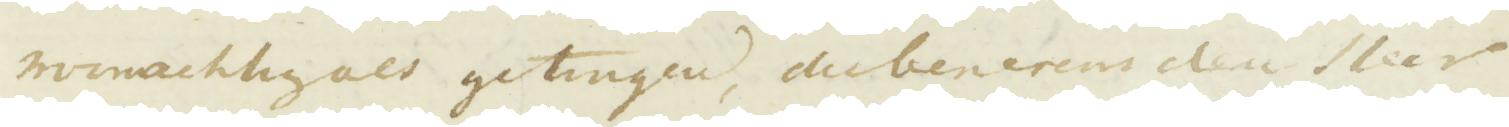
woonachtig als getuigen, die benevens deze Heer
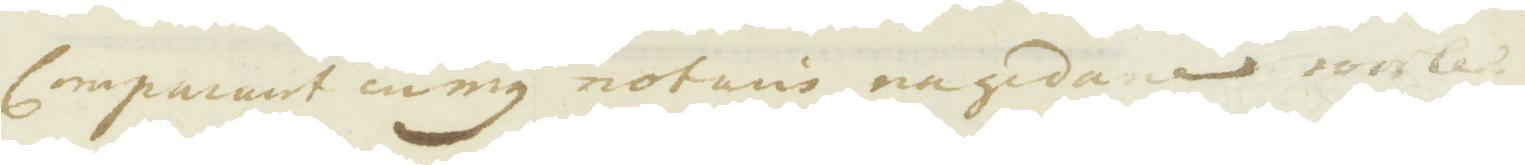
Comparant en my notaris na gedane voorle„
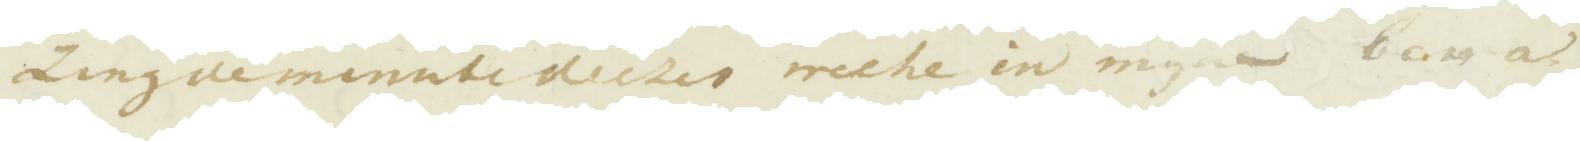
zing de minute deezes welke in myne bewa
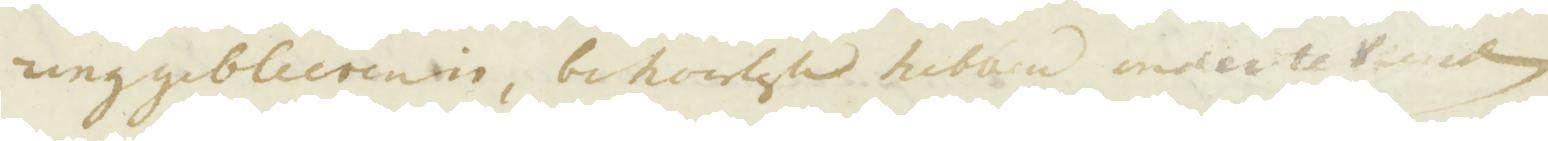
ring gebleeven is, behoorlyk hebben ondertekend
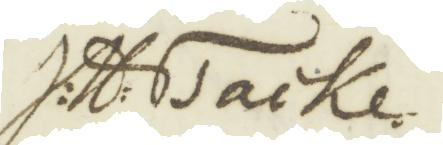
J:H: Tacke
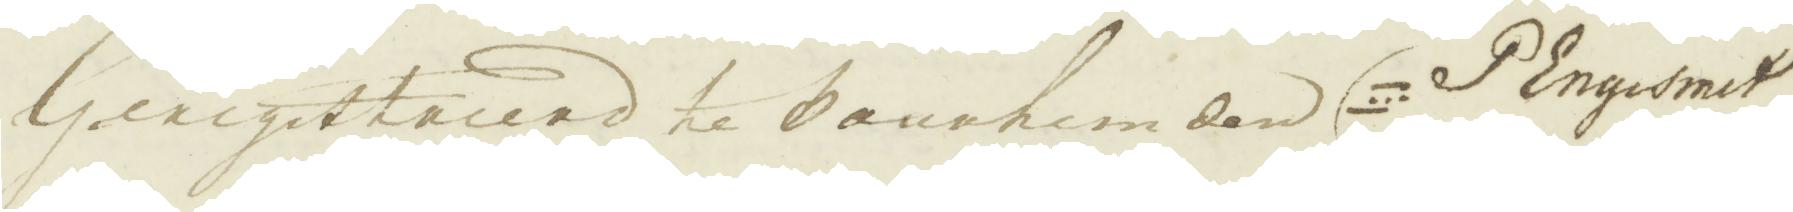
Geregistreerd te Haarlem den P Engesmet
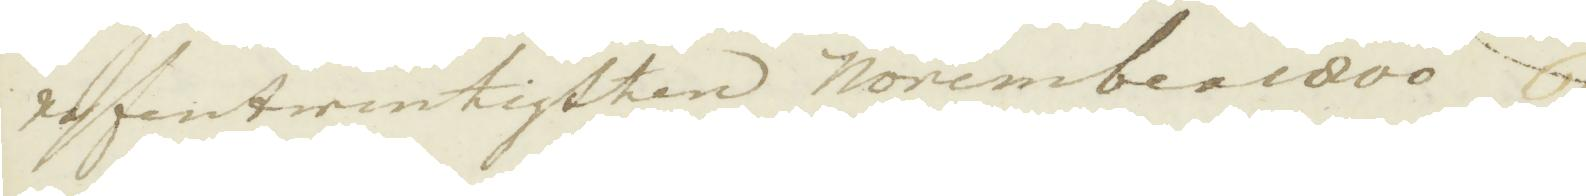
vyfentwintigsten november 1800
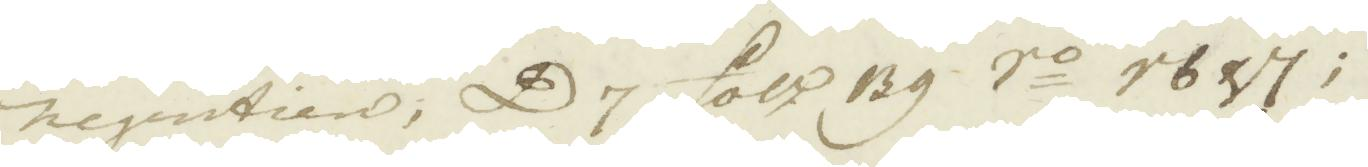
negentien; D7 fol.i 19 r=o 1627;
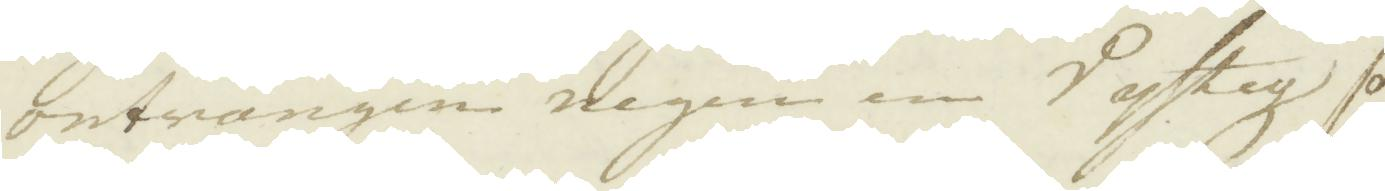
ontvangen negen en vyftig
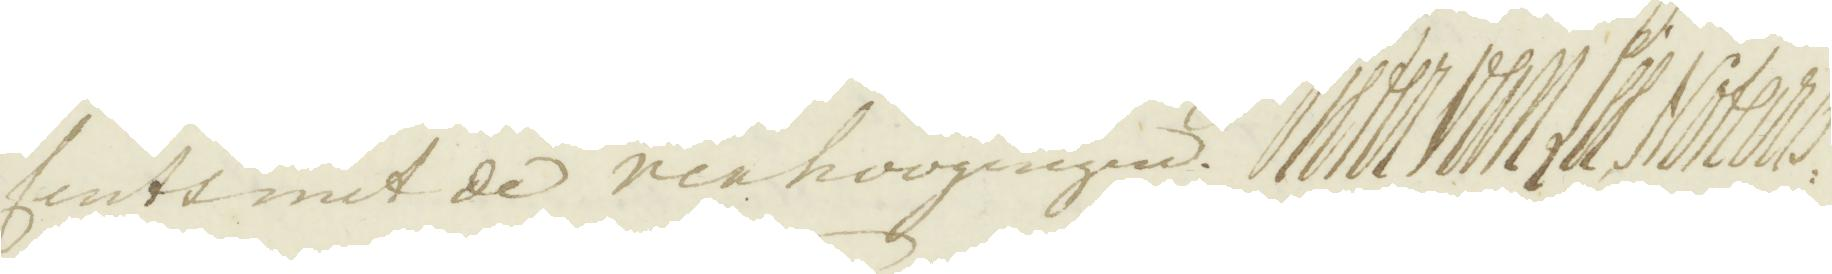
Cents met de verhoogingen. Pieter van Leè Notaris.
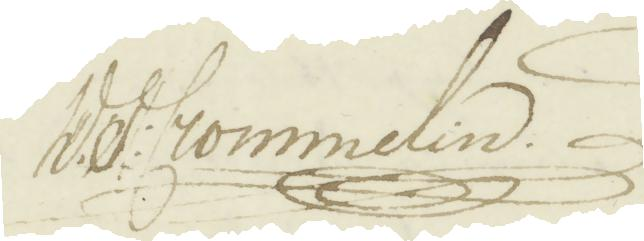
D. S: Crommelin.
